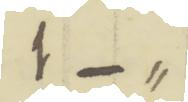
1 – „
